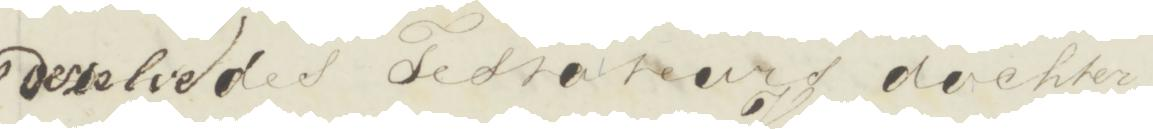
dezelve des Testateurs dochter
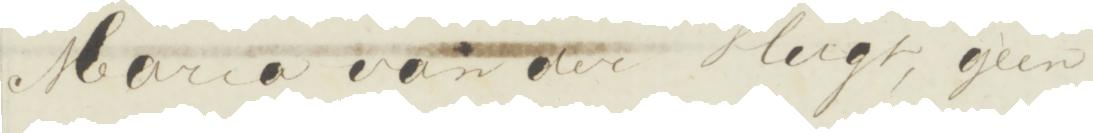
Maria van der Vlugt, geen
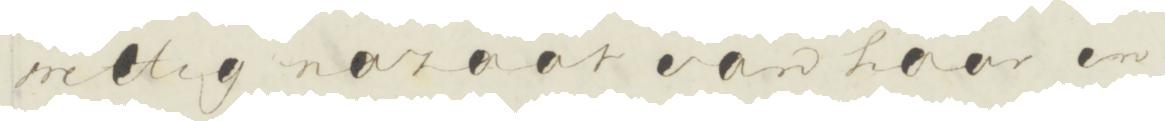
wettig nazaat van haar in
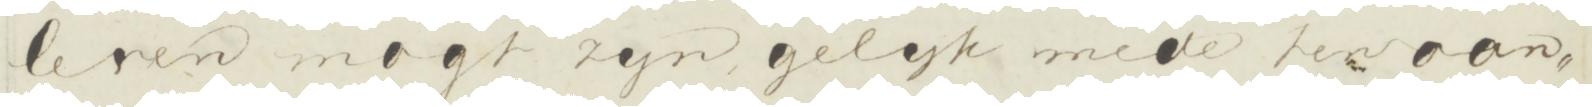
leven mogt zyn, gelyk mede ten aan„
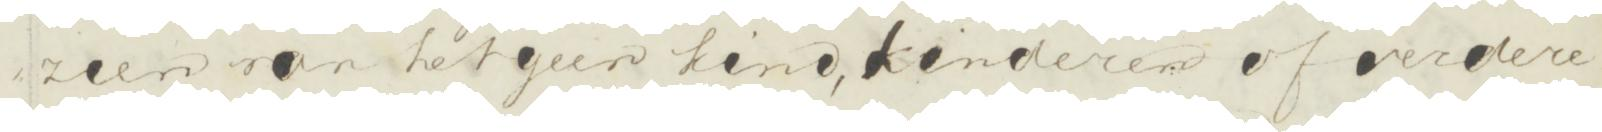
„zien van hetgeen kind, kinderen of verdere
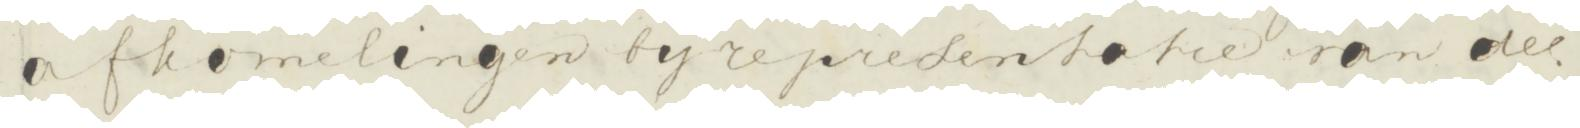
afkomelingen by representatie van de.
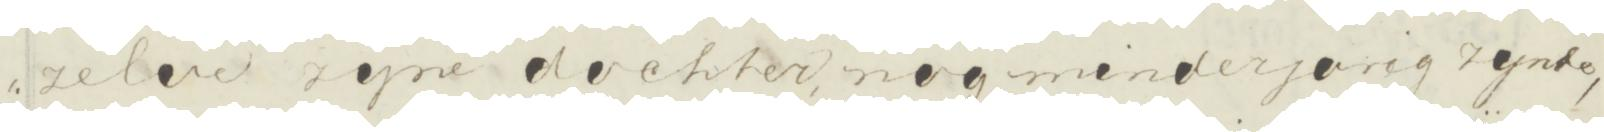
„zelve zyne dochter, nog minderjarig zynde,
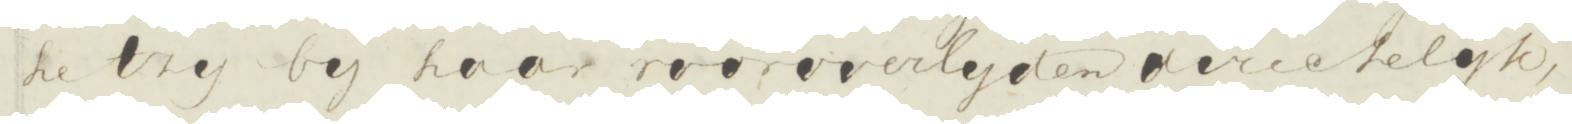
hetzy by haar vooroverlyden directelijk,
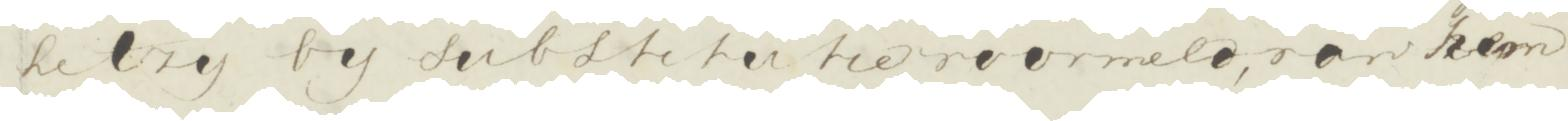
hetzy by substitutie voormeld, van hem
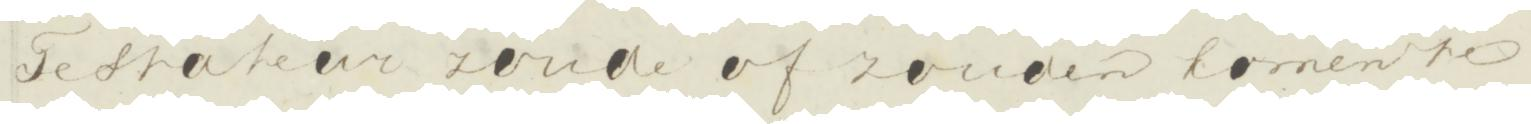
Testateur zoude of zouden komen te
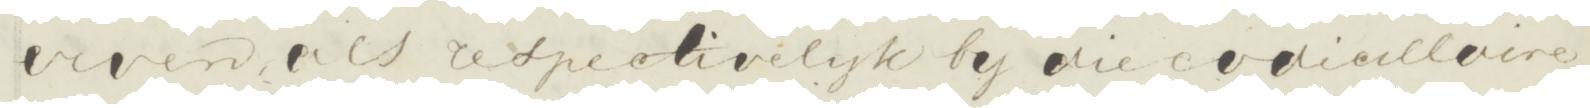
erven, als respectivelyk by die codicilloire
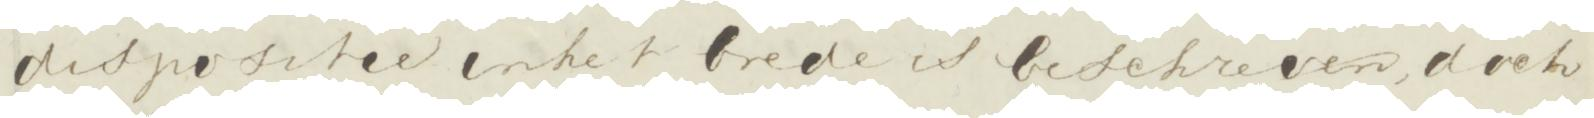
dispositie in het brede is beschreven, doch
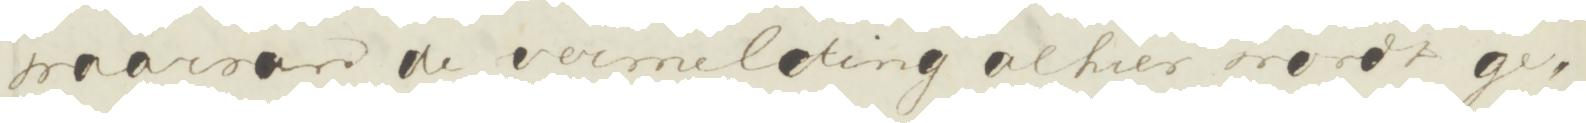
waarvan de vermelding alhier wordt ge„
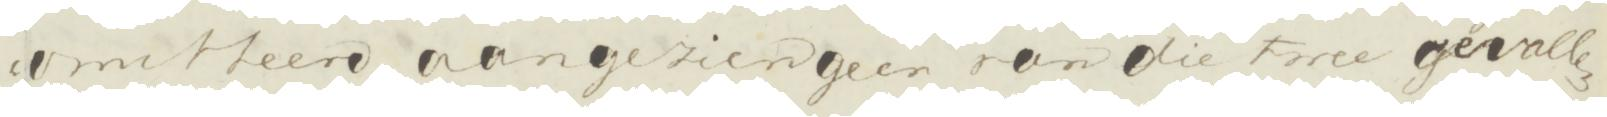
„omitteerd aangezien geen van die twee gevallen
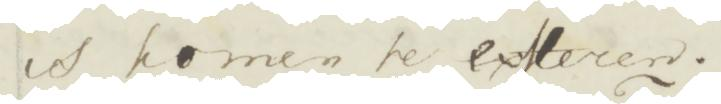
is komen te exsteren.
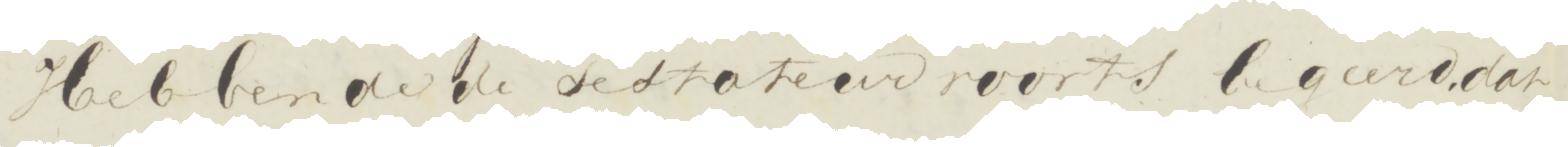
Hebbende de Testateur voorts begeerd, dat
